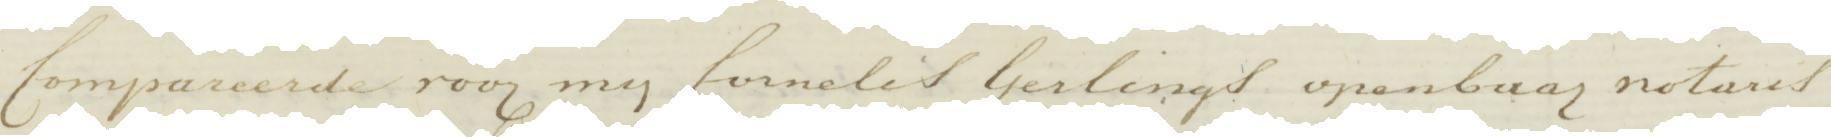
Compareerde voor my Cornelis Gerlings, openbaar notaris
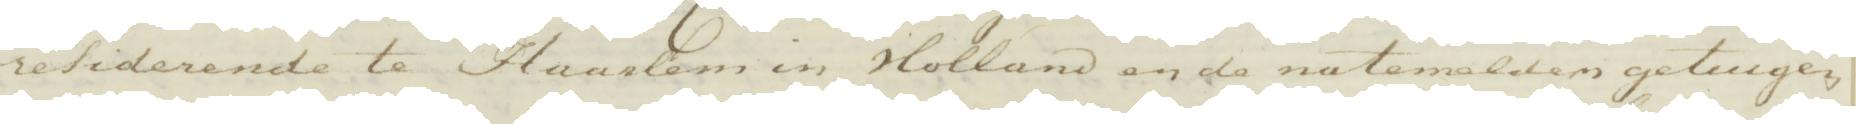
residerende te Haarlem in Holland en de natemelden getuigen
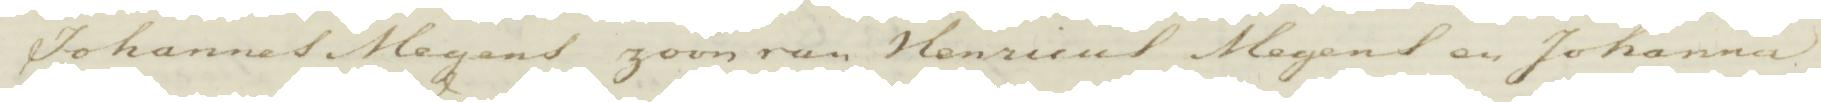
Iohannes Megens zoon van Henricus Megens en Johanna
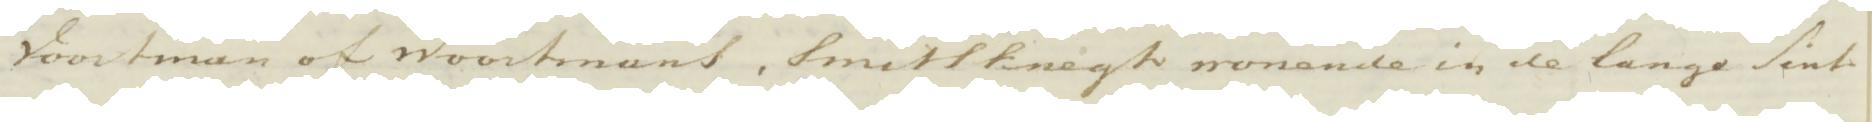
Voortman of Woortmans, smitsknegt wonende in de lange sint
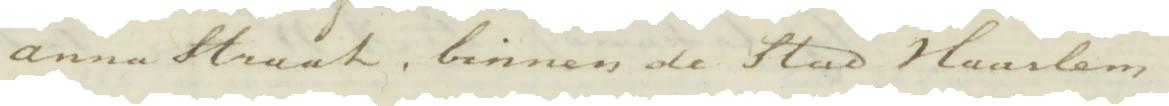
anna straat, binnen de stad Haarlem
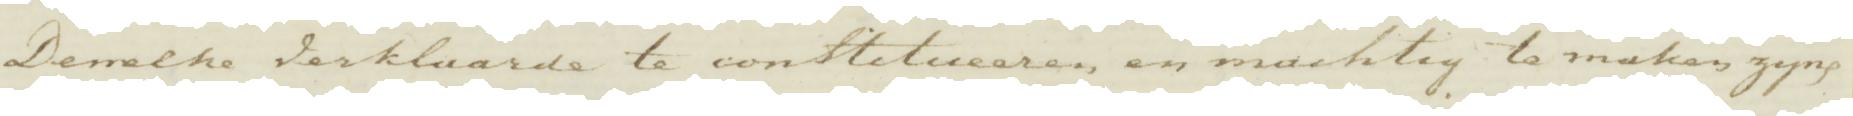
Dewelke verklaarde te constitueeren en machtig te maken zyne
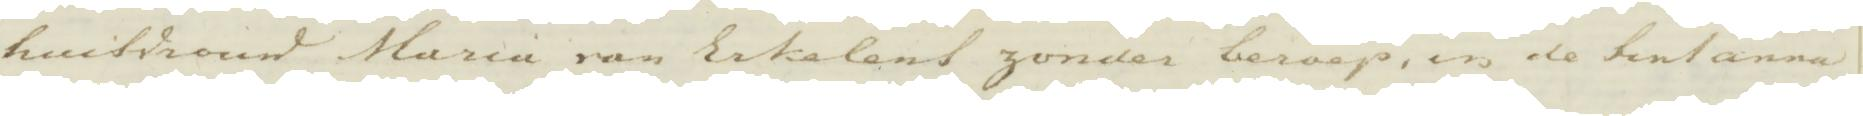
huisvrouw Maria van Erkelens zonder beroep, in de sint anna
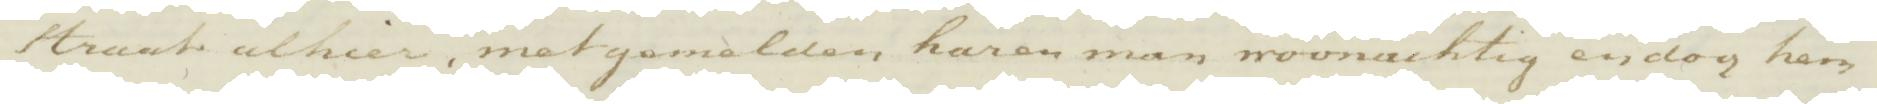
straat alhier, met gemelden haren man woonachtig en door hem
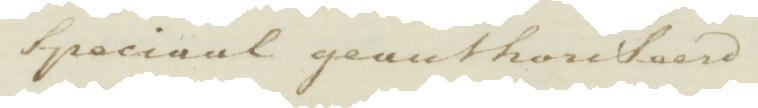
speciaal geauthoriseerd
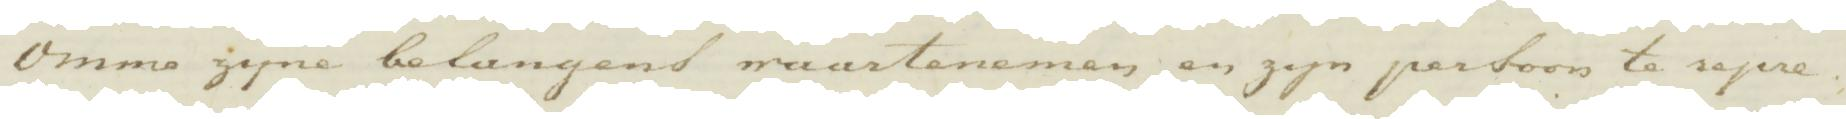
Omme zyne belangens waartenemen en zyn persoon te repre
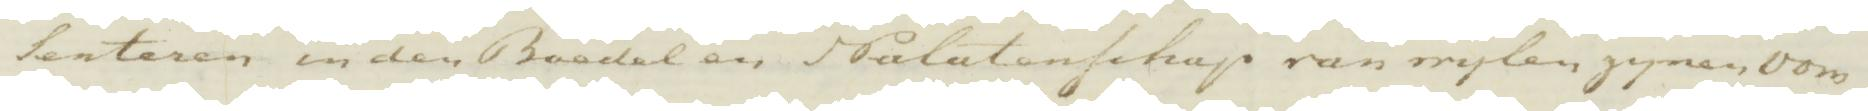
senteren in den Boedel en Nalatenschap van wylen zynen oom
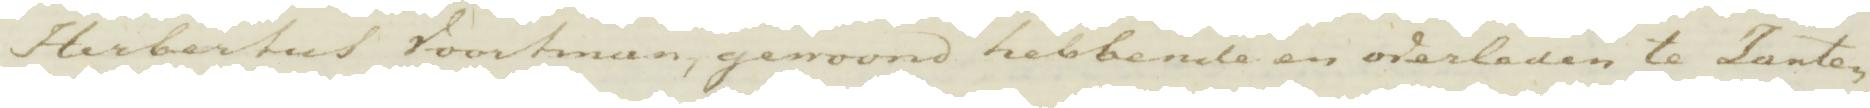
Herbertus Voortman, gewoond hebbende en overleden te Zanten
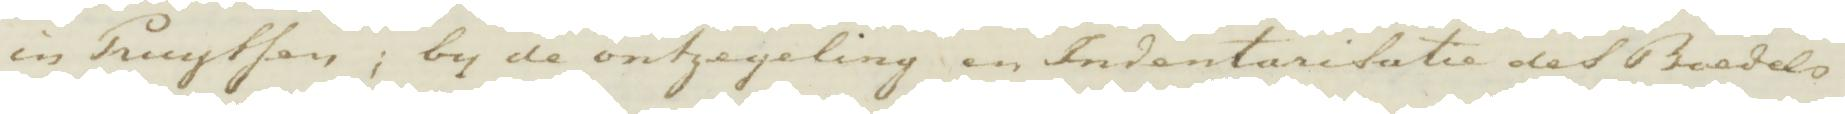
in Pruyssen; by de ontzegeling en Inventarisatie des Boedels
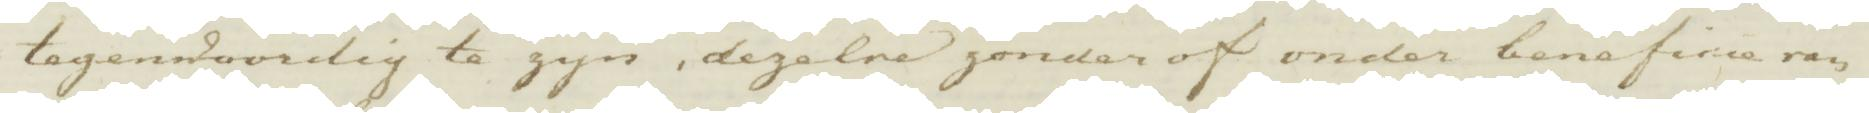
tegenwoordig te zyn, dezelve zonder of onder beneficie van
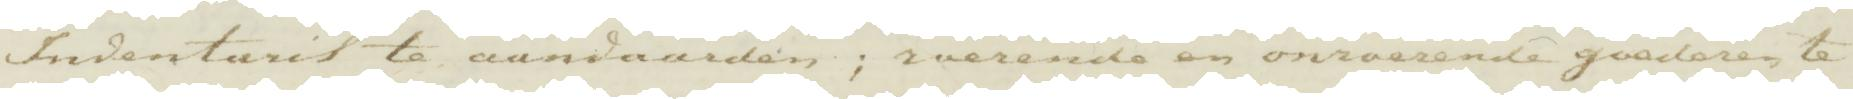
Inventaris te aanvaarden; roerende en onroerende goederen te
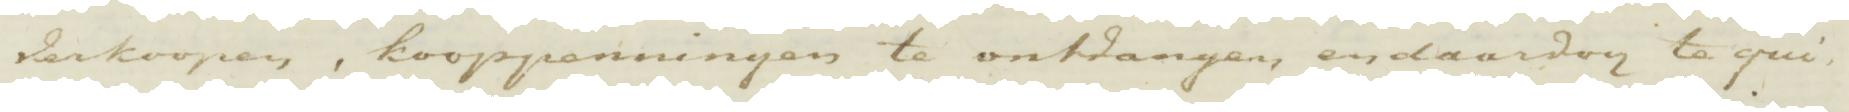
verkoopen, kooppenningen te ontvangen, en daardoen te qui,
